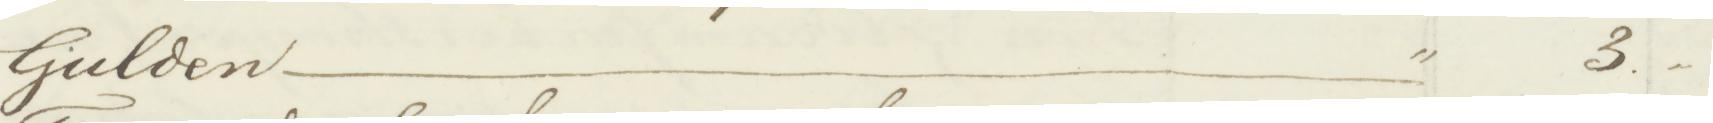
Gulden —„ 3.„
